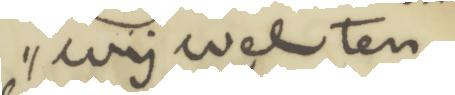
„wij wel ten
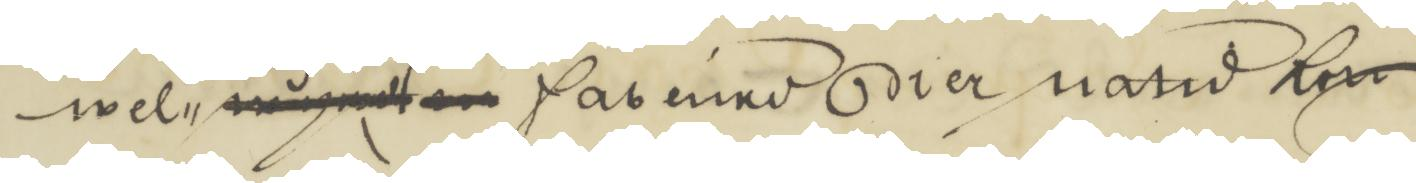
wel„ wy met en faveure dier natie kon
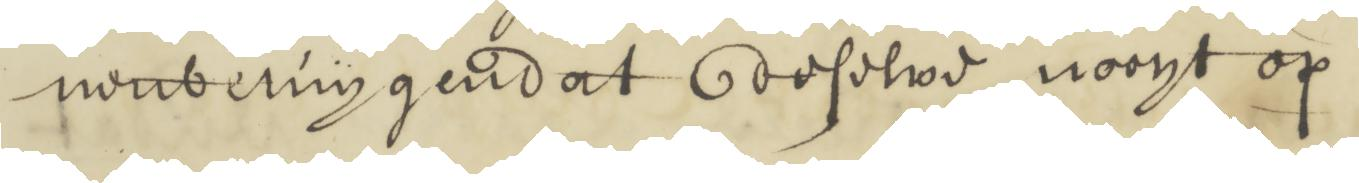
nen betuijgen dat deselve nooyt op
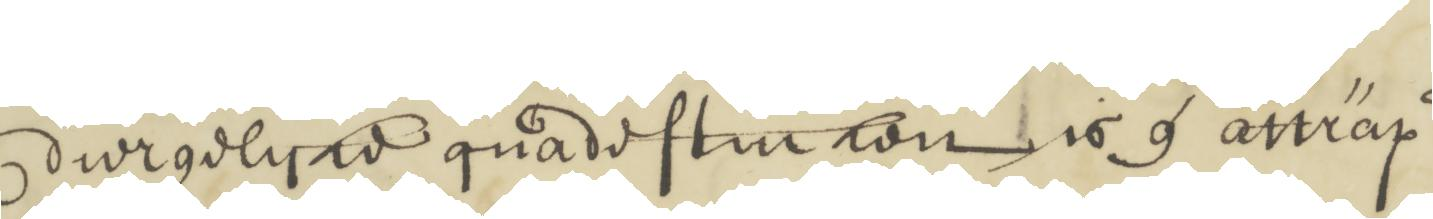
dier gelyte quadestucken is g’attrap„
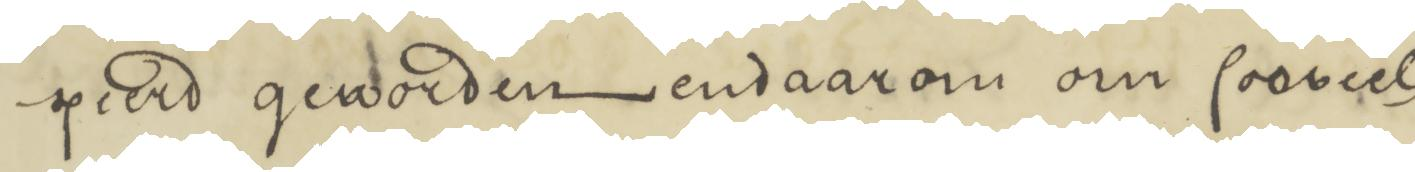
peerd geworden en daarom om sooveel
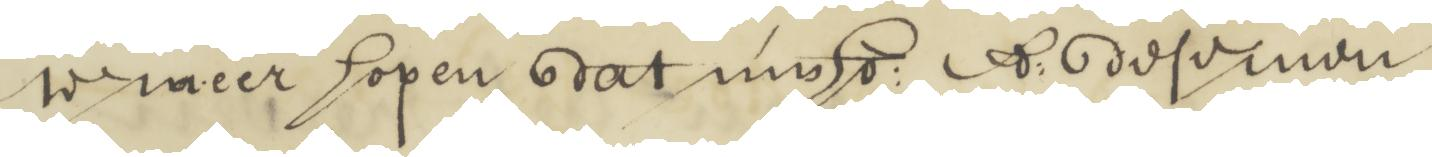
te meer hopen dat uw ho: Ed: dese men
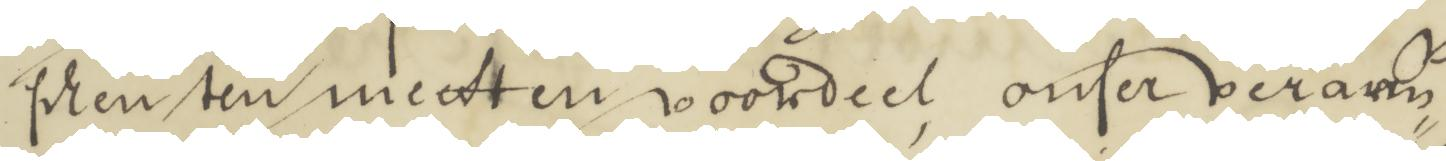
schen ten meesten voordeel, onser verarm„
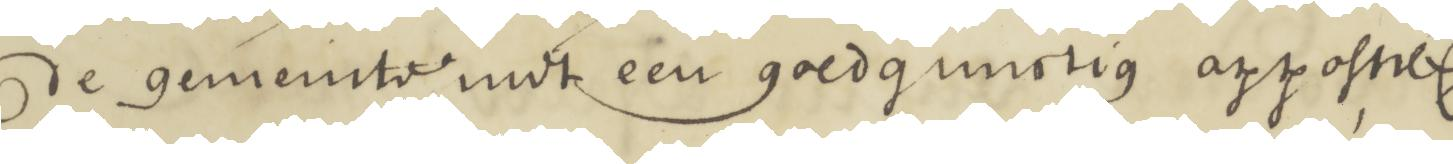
de gemeinte met een goedgunstig appostil
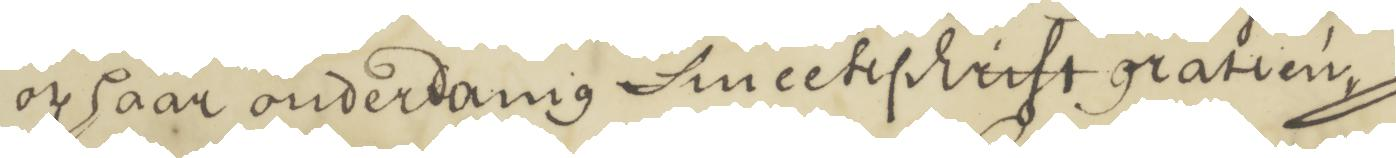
op haar onderdanig smeekschrift gratieu„
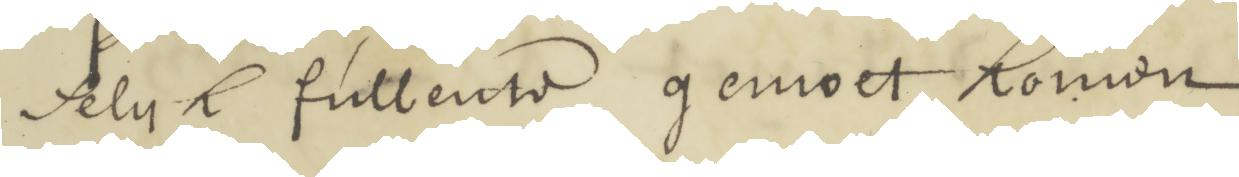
selyk sullente gemoet komen
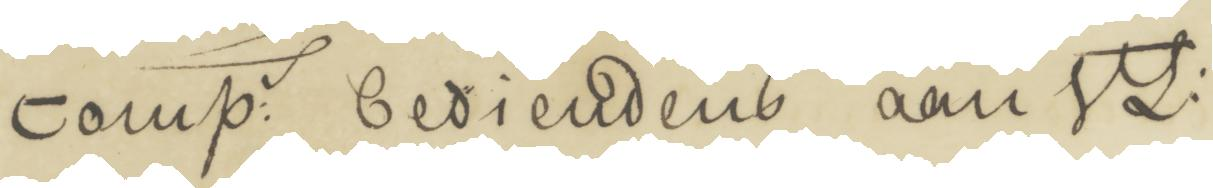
Comp:s bediendens aan UE:
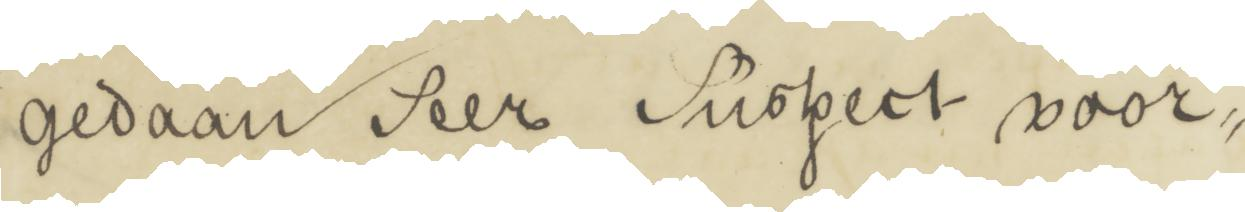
gedaan seer suspect voor„
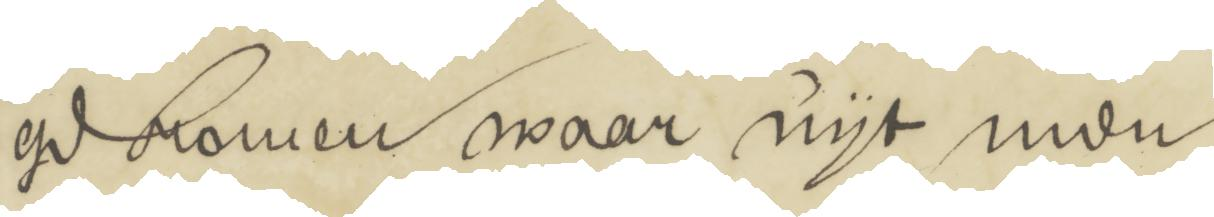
gekomen waar uijt men
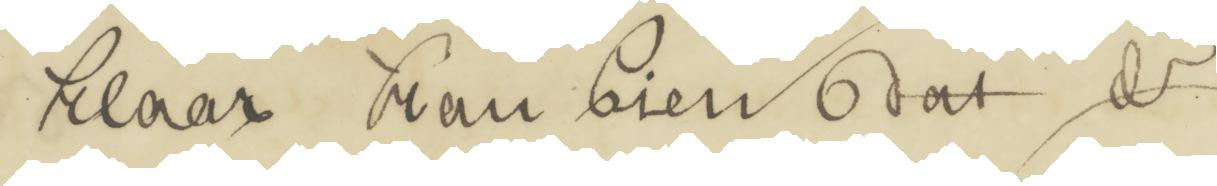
klaar kan sien dat de
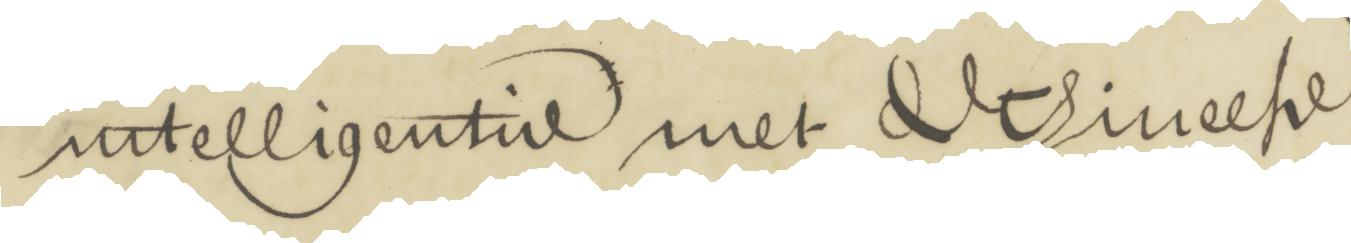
intelligentie met de Chineese
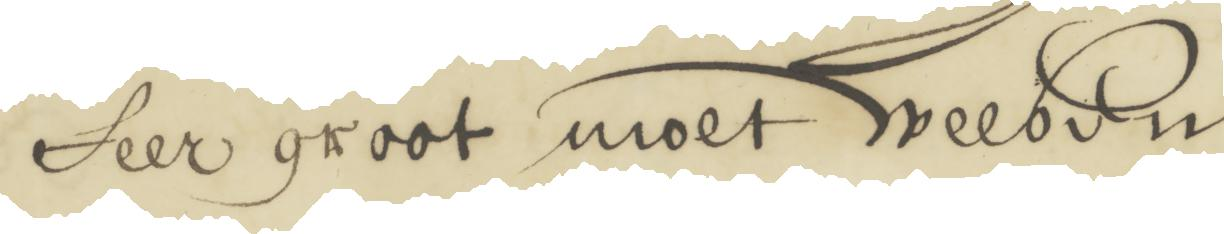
seer groot moet weesen
